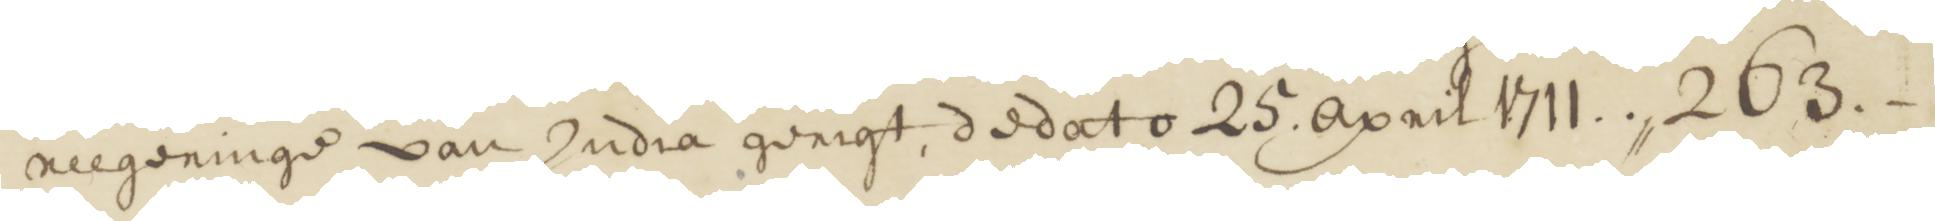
reegeringe van Jndia gerigt, dedato 25. April 1711. . „ 263. —
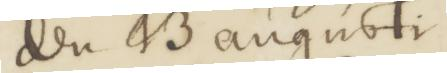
den 13 augusti
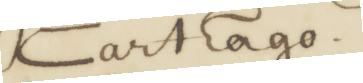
Carthago.
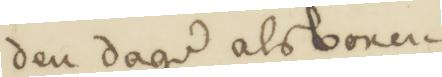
den dage alsvoren
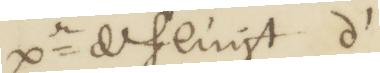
p=r defluijt d’
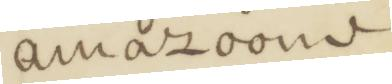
amazoone
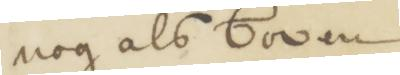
nog als boven
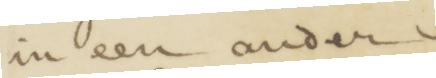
in een ander
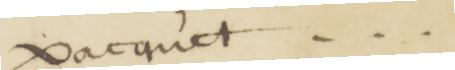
pacquet - - -
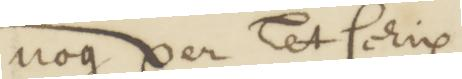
nog per het schip
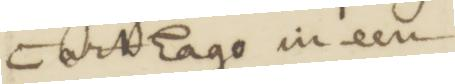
Carthago in een
